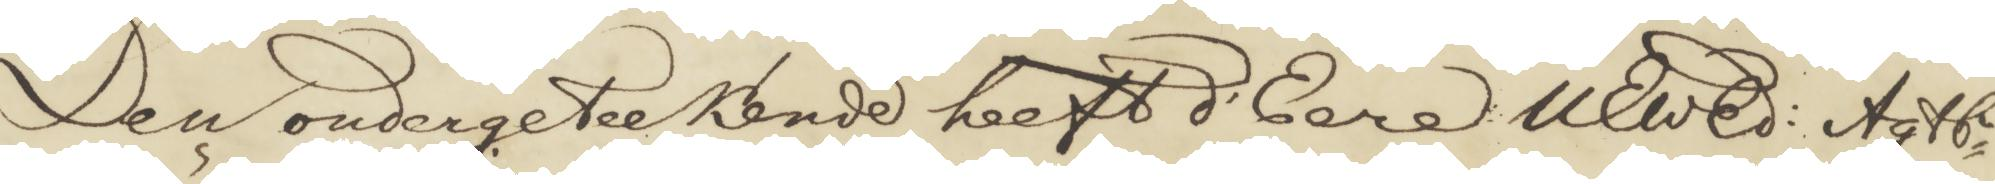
Den ondergeteekende heeft d' Eere UEwEd: Agtb„r
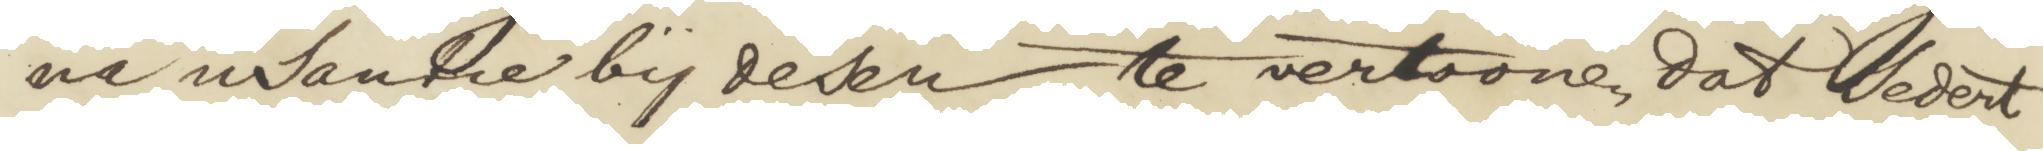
na usantie bij desen te vertoonen dat Sedert
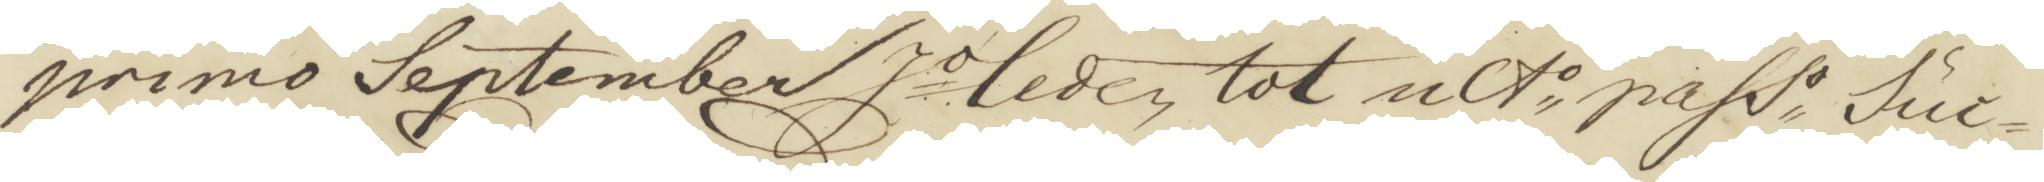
primo September J=oleden tot ult„o pass„o Suc=
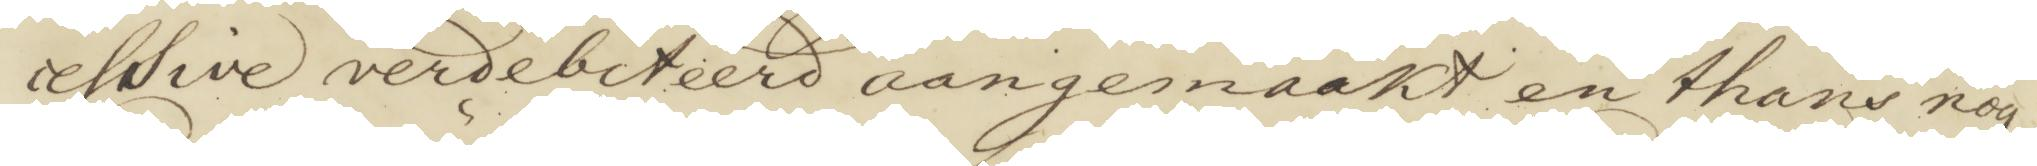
cessive verdebiteerd aangemaakt en thans nog
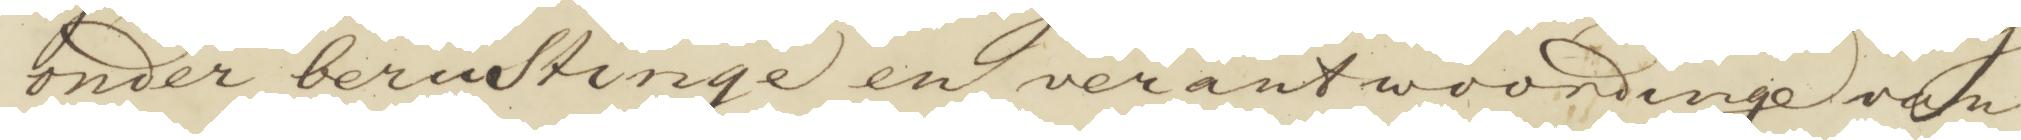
onder berustinge en verantwoordinge van
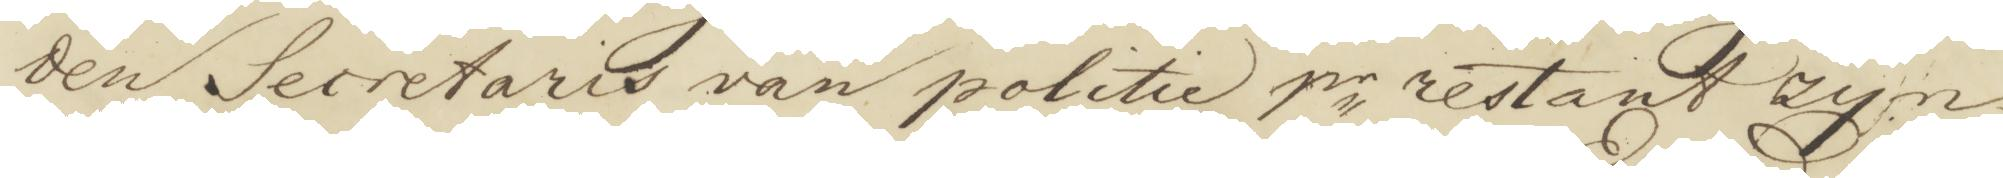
den secretaris van politie p„r restant zijn
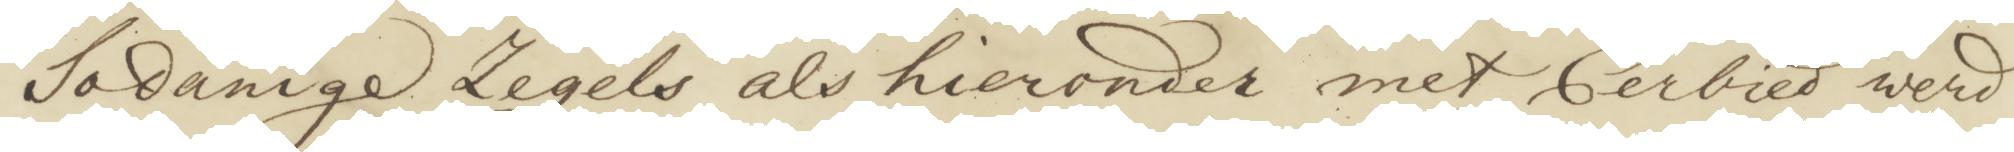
sodanige Zegels als hieronder met Eerbied werd
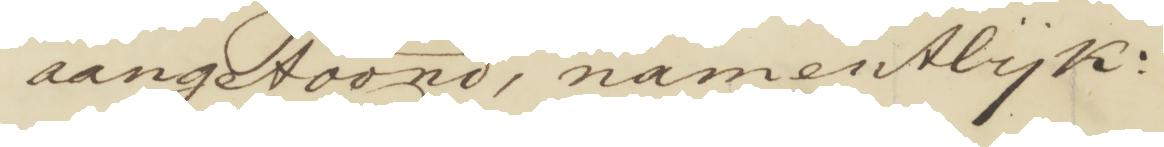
aangetoond, namentlijk:
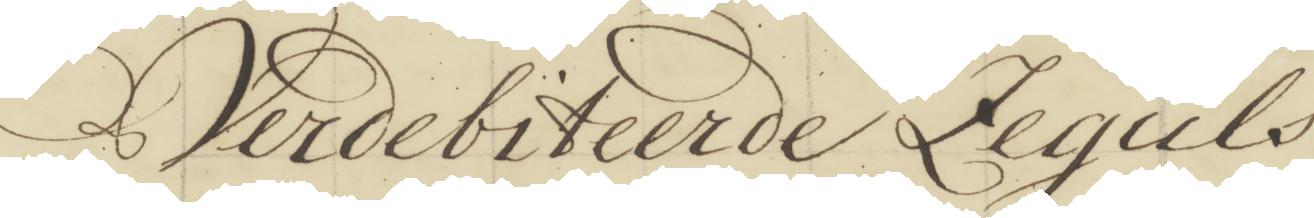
Verdebiteerde Zeguls
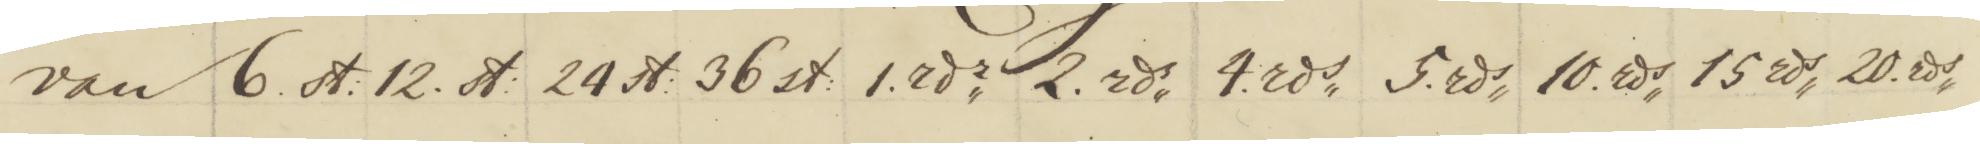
van 6. st: 12. st: 24 st: 36 st: 1. rd„r 2. rd„s 4. rd„s 5. rd„s 10. rd„s 15 rd„s 20. rd„s
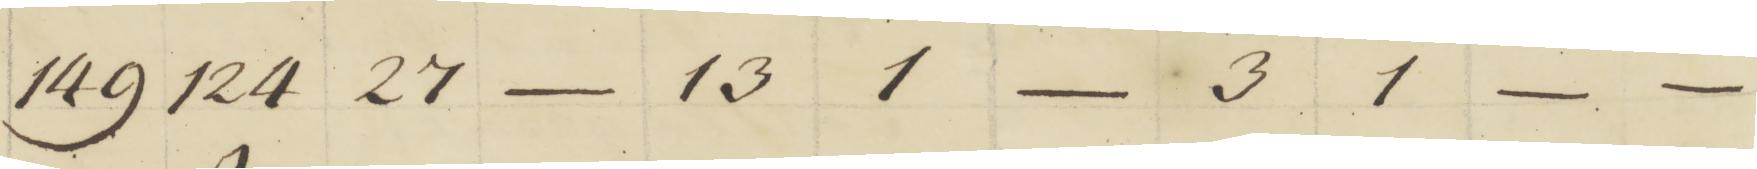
149 124 27 - 13 1 - 3 1 - -
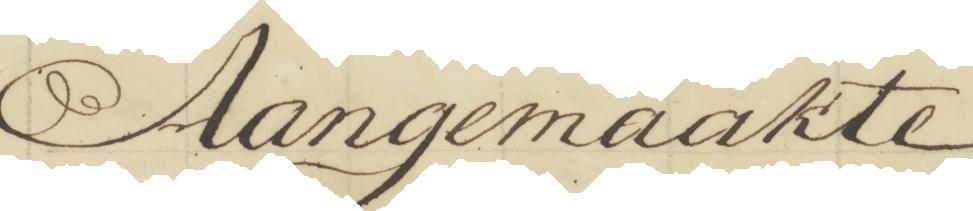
Aangemaakte
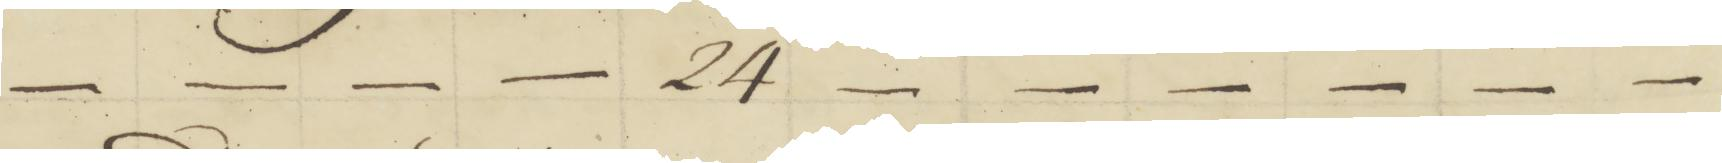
- - - - 24 - - - - - -
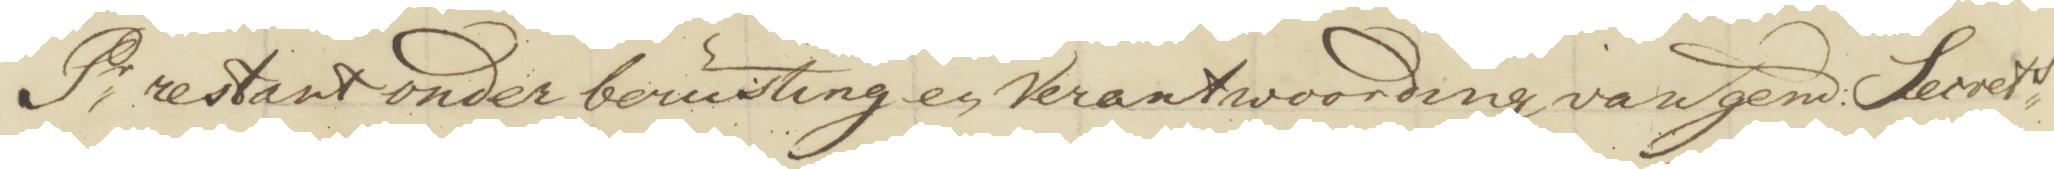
P„r restant onder berusting en Verantwoording van gem: Secret„s
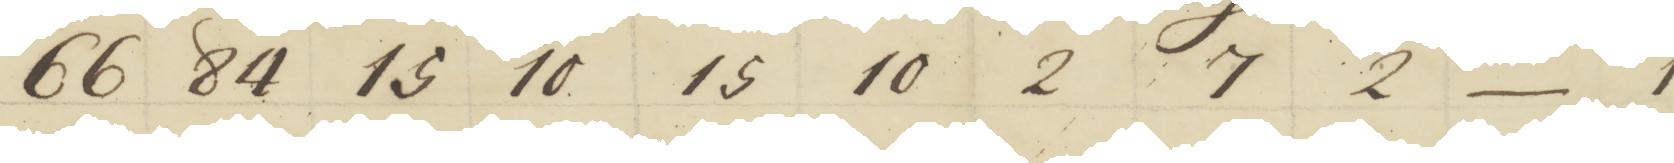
66 84 15 10 15 10 2 7 2 - 1
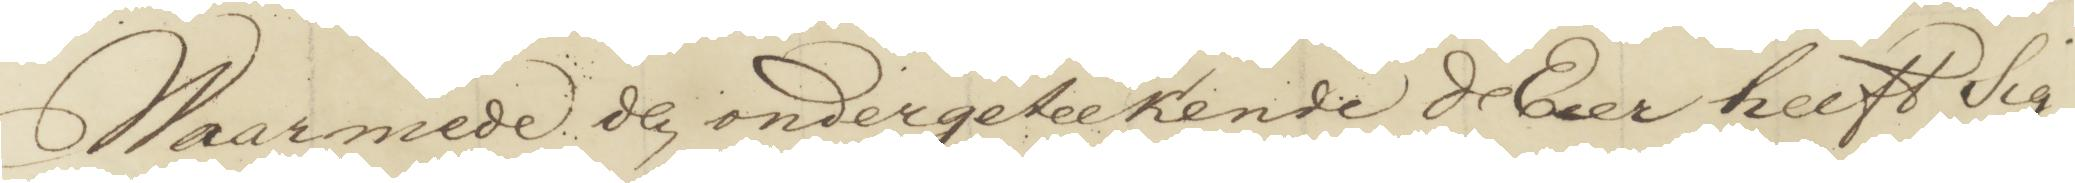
Waarmede den ondergeteekende de Eer heeft Sig
